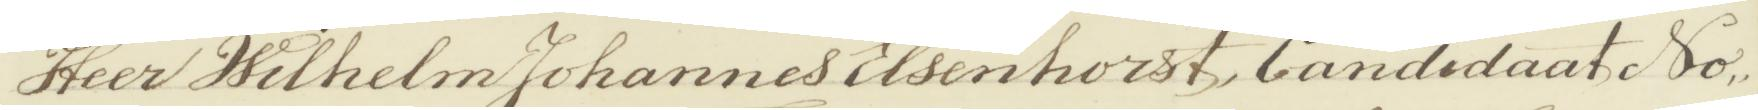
Heer Wilhelm Johannes Elsenhorst, Candidaat No„
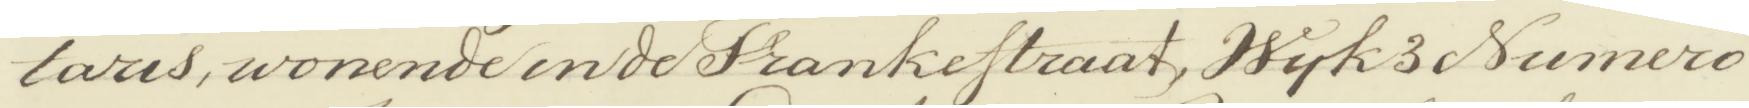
taris, wonende in de Frankestraat, Wyk 3 Numero
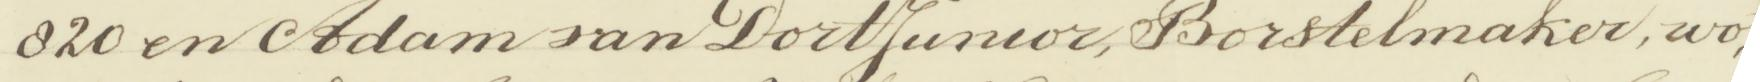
820 en Adam van Dort Junior, Borstelmaker, wo„
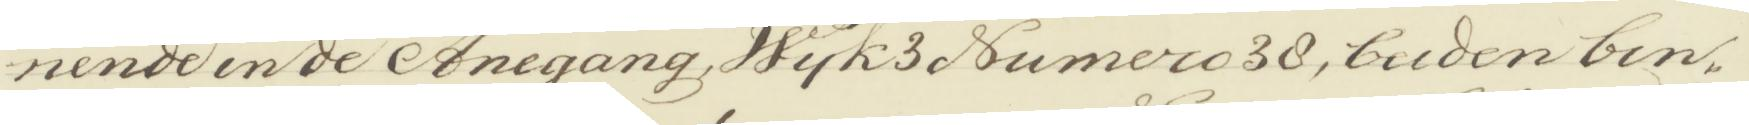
nende in de Anegang, Wyk 3 Numero 38, beiden bin„
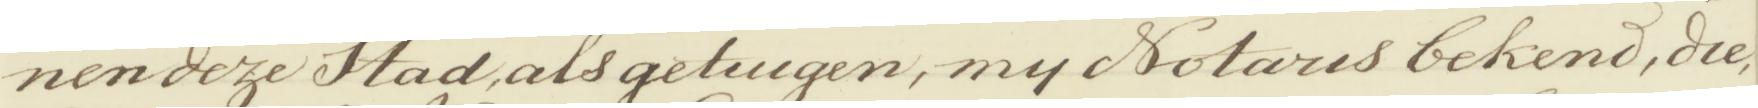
nen deze stad, als getuigen, my Notaris bekend, die,
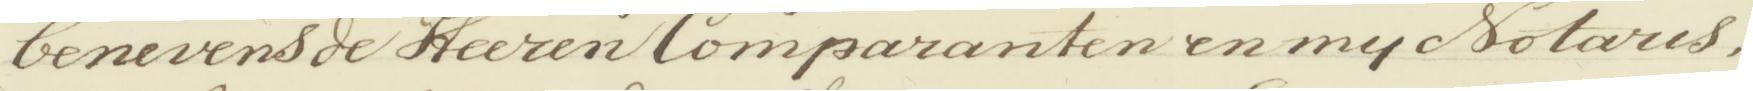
benevens de Heeren Comparanten en my Notaris,
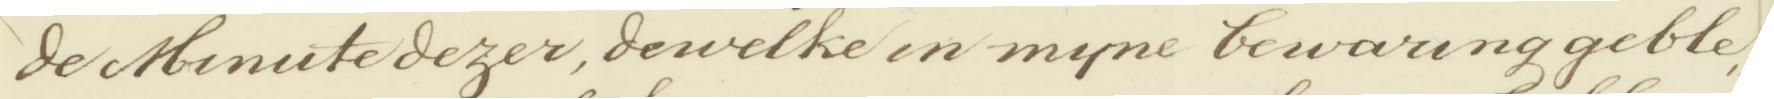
de Minute dezer, dewelke in myne bewaring geble„
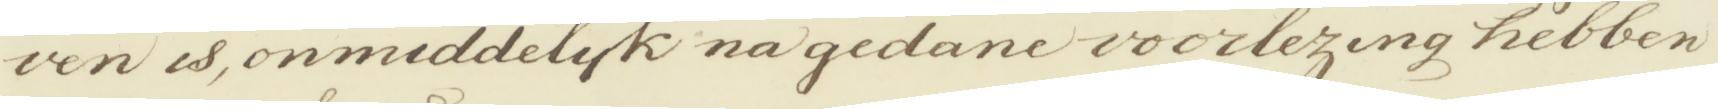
ven is, onmiddelyk na gedane voorlezing hebben
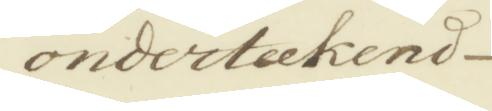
onderteekend-
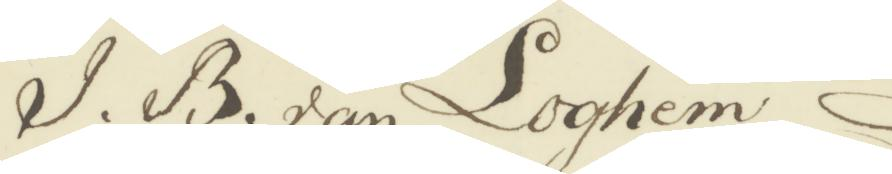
J. B. van Loghem
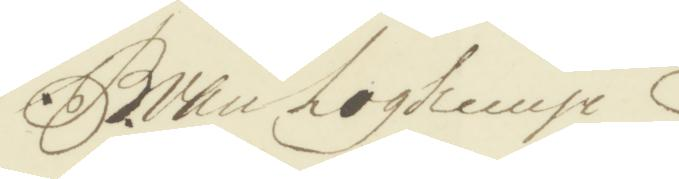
B van Loghemjr
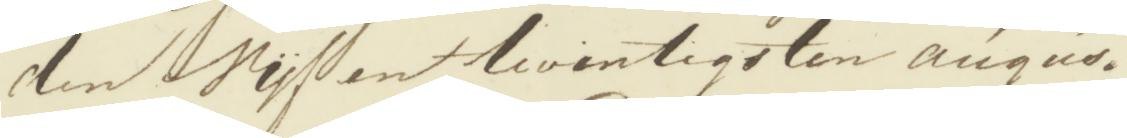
den Vijf en twintigsten augus.
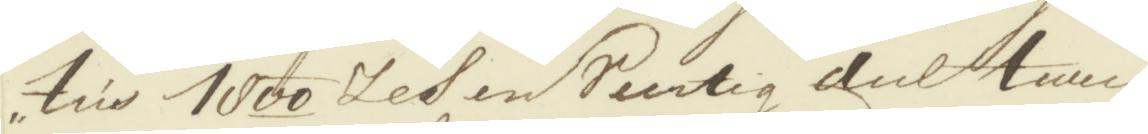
„tus 1800 Zes en Veertig deel twee
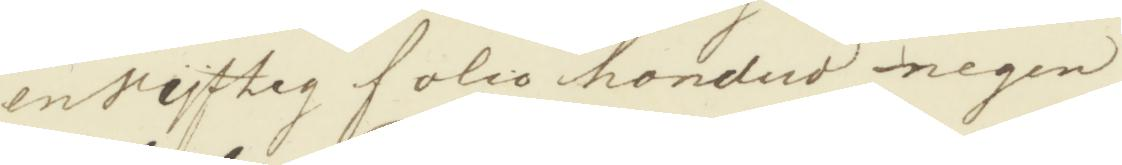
en vijftig folio honderd negen
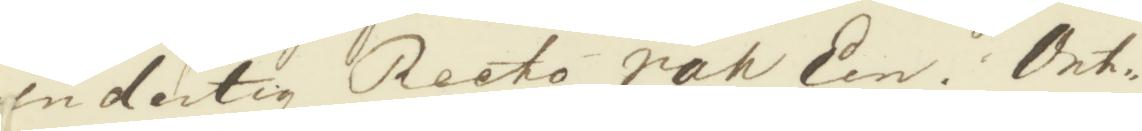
en dertig Recto vak Een. Ont„
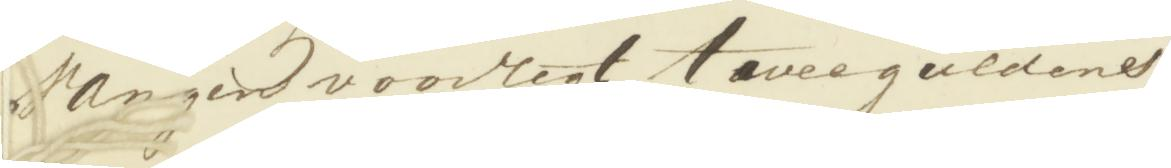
vangen voor regt twee guldens
